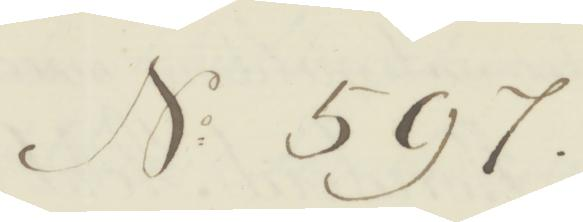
N:o 597.
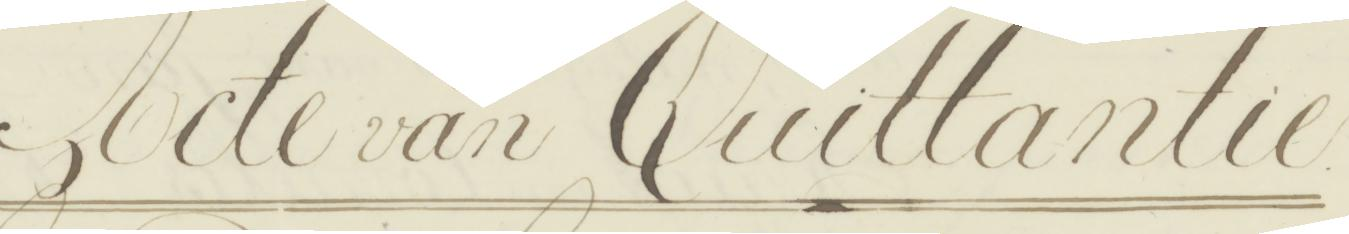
Acte van Quittantie
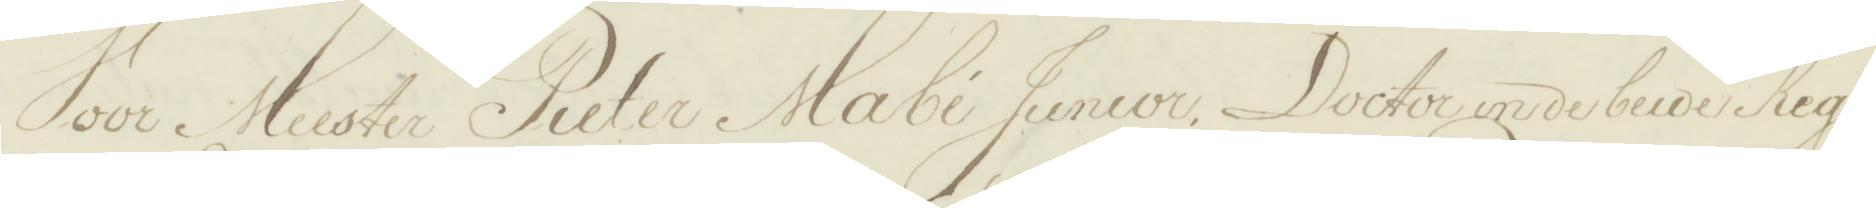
Voor Meester Pieter Mabé Junior, Doctor in de beede Reg
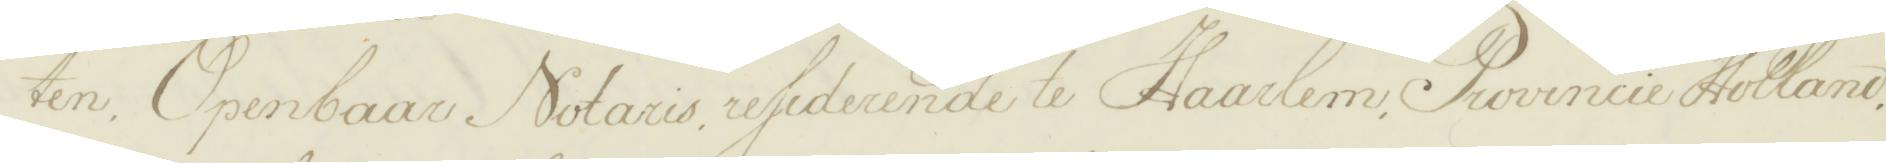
ten, Openbaar Notaris, residerende te Haarlem, Provincie Holland,
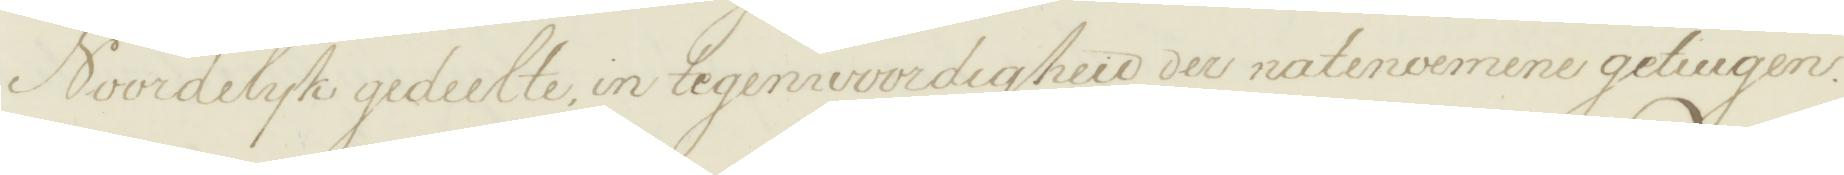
Noordelyk gedeelte, in tegenwoordigheid der natenoemene getuigen
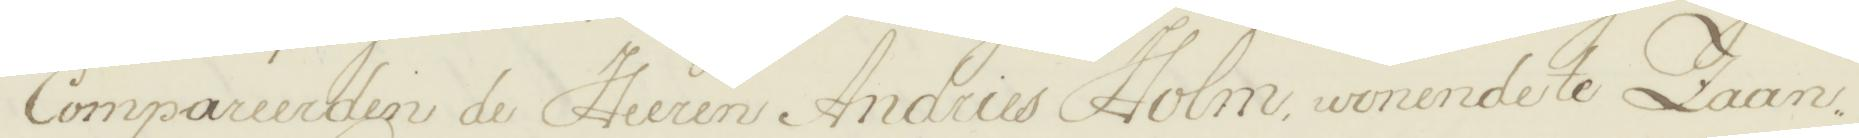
Compareerden de Heeren Andries Holm, wonende te Zaan„
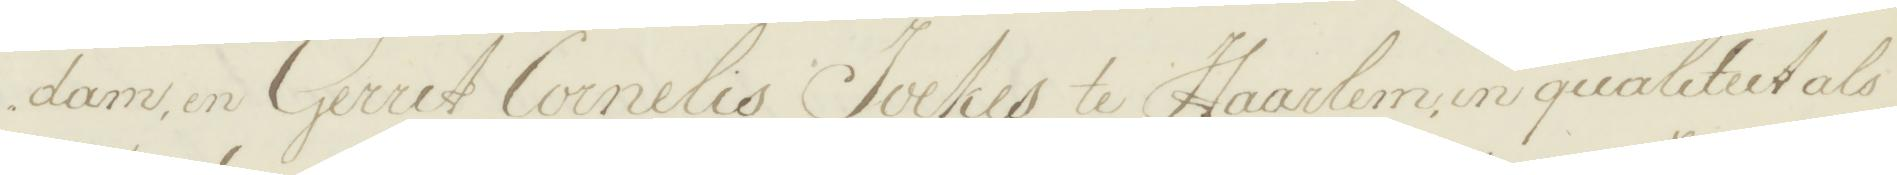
„dam, en Gerrit Cornelis Ioekes te Haarlem, in qualiteit als
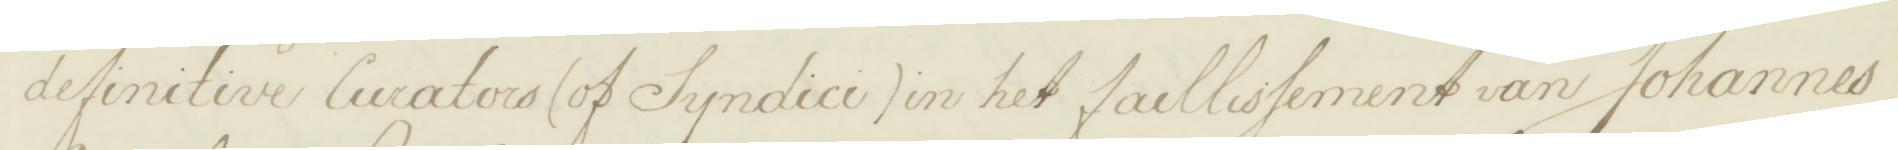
definitive Curators (of Syndici) in het faillissement van Johannes
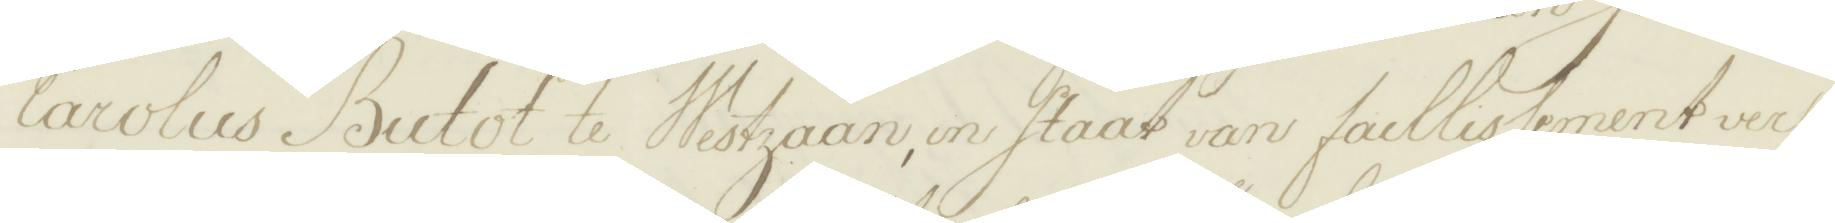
Carolus Butot te Westzaan, in staat van faillissement ver
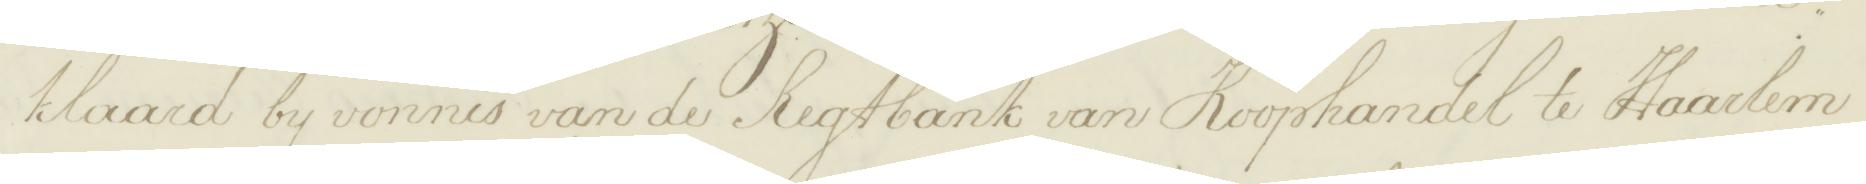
klaard by vonnis van de Regtbank van Koophandel te Haarlem
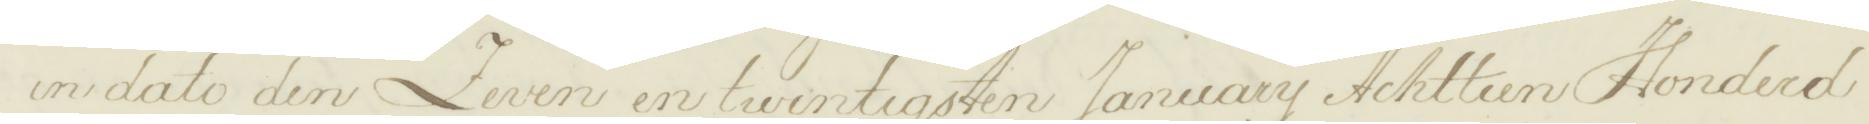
in dato den Zeven en twintigsten January Achttien Honderd
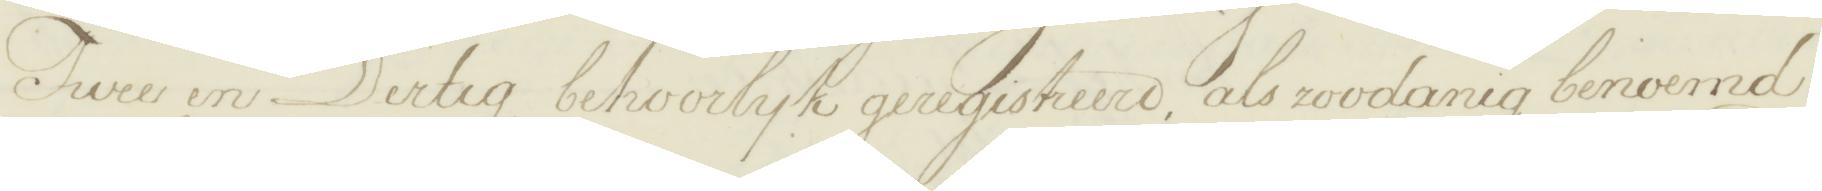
Twee en Dertig, behoorlyk geregisteerd, als zoodanig benoemd
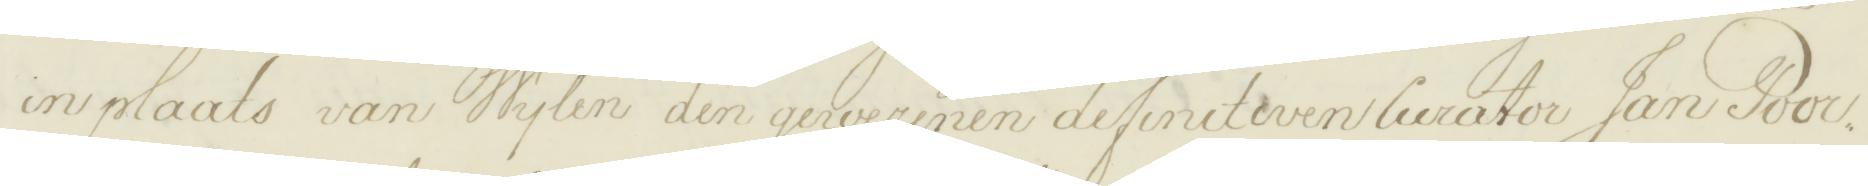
in plaats van Wylen den gewezenen definitiven Curator Jan Poor„
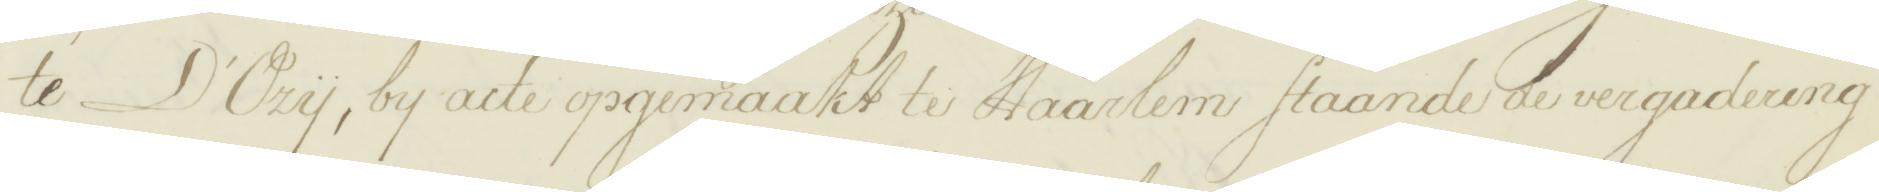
te D' Orij, by acte opgemaakt te Haarlem staande de vergadering
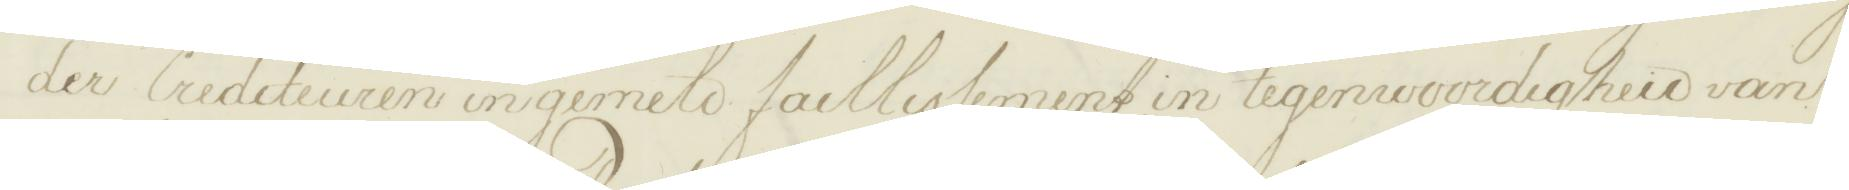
der Crediteuren in gemeld faillissement, in tegenwoordigheid van
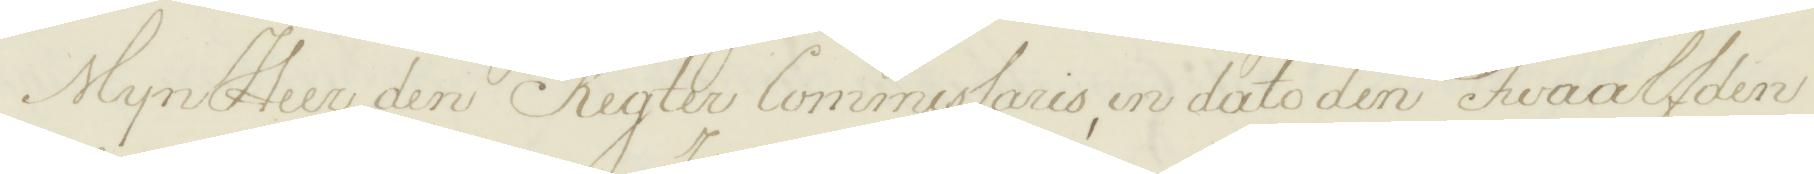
Myn Heer den Regter Commissaris, in dato den Twaalfden
